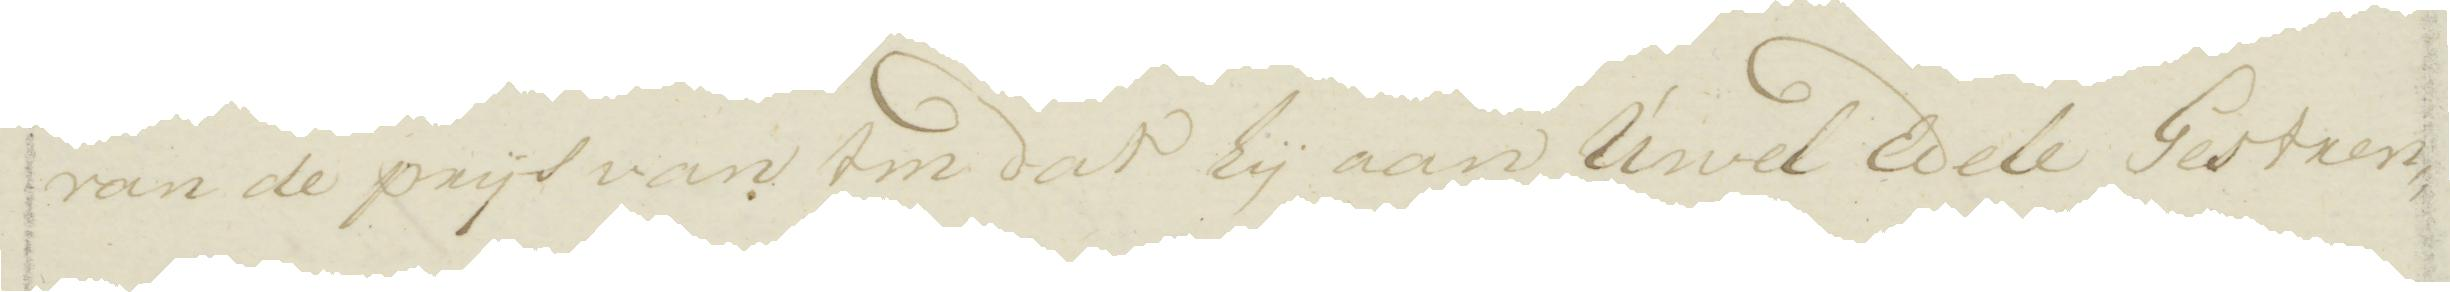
van de prijs van tin dat hij aan Uwel Edele Gestren„
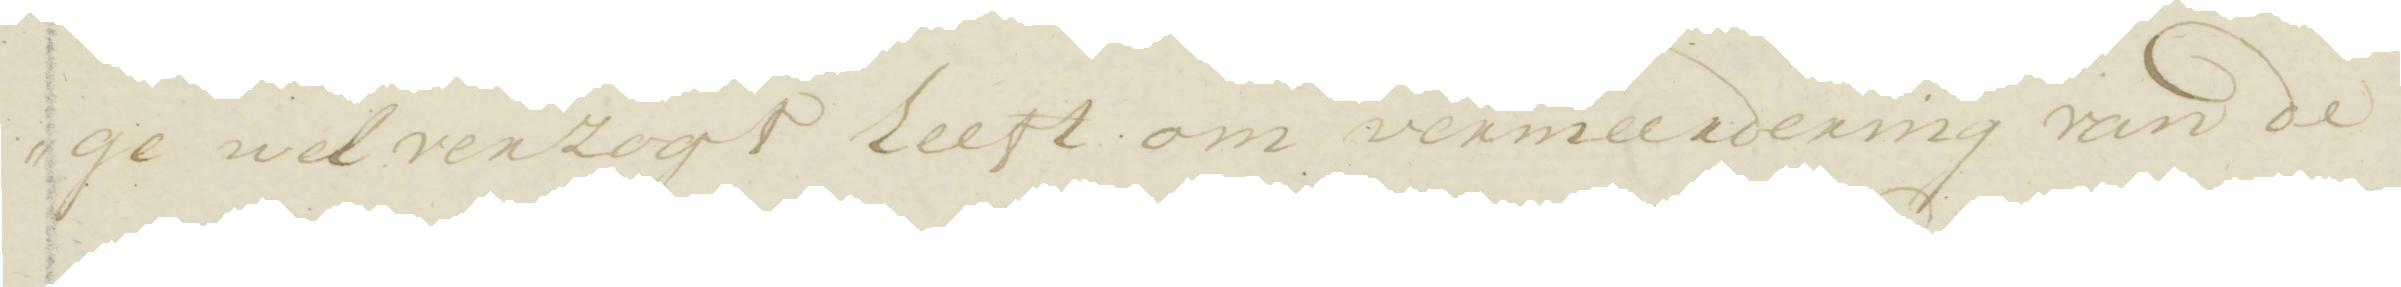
„ge wel verzogt heeft om vermeerdering van de
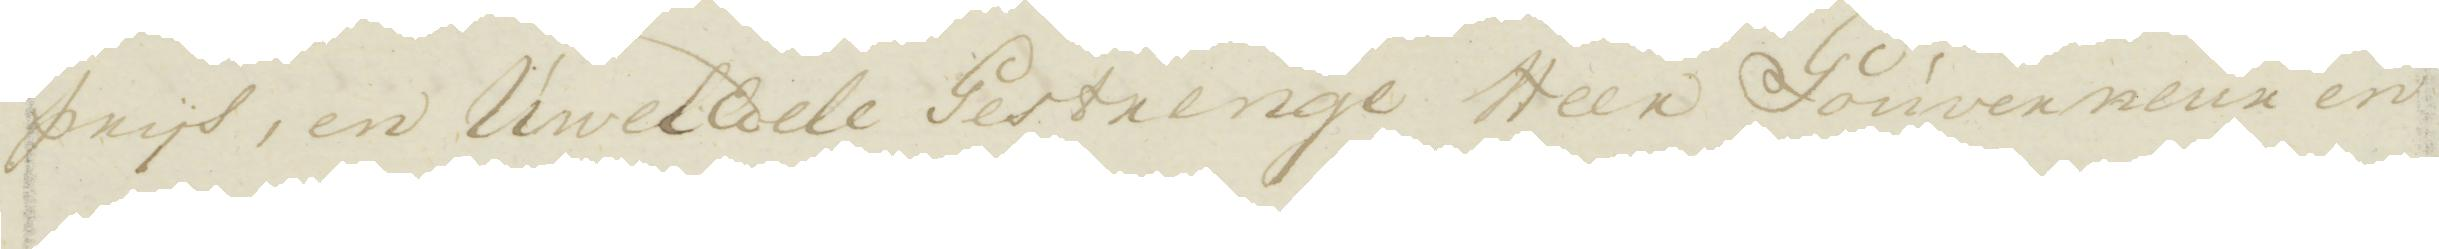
prijs, en Uwel Edele Gestrenge Heer Gouverneur en
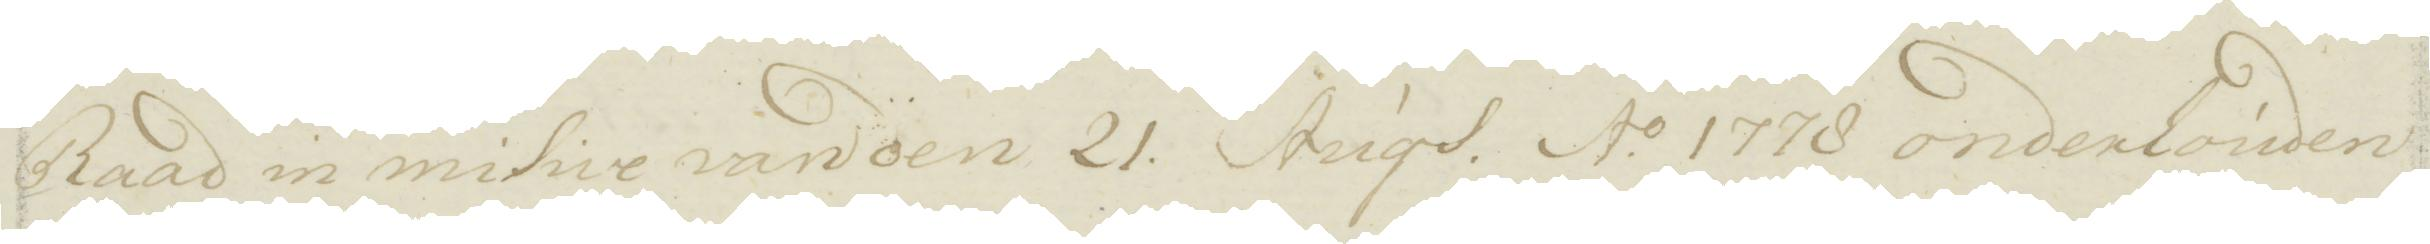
Raad in misive van den 21. Augs. A:o 1778 onderhouden
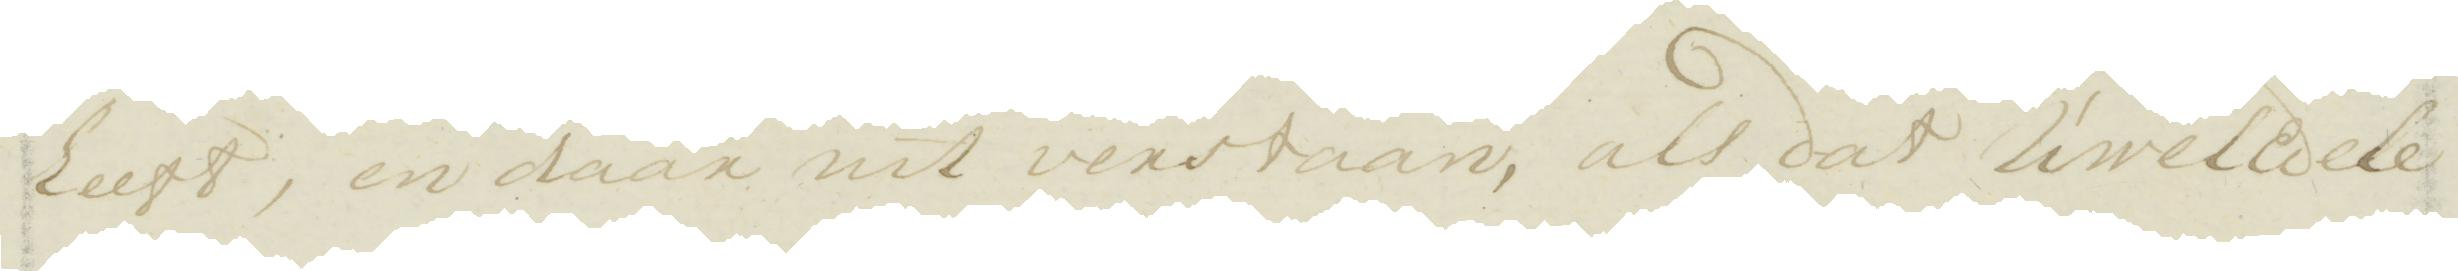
heeft, en daar uit verstaan, als dat Uwel Edele
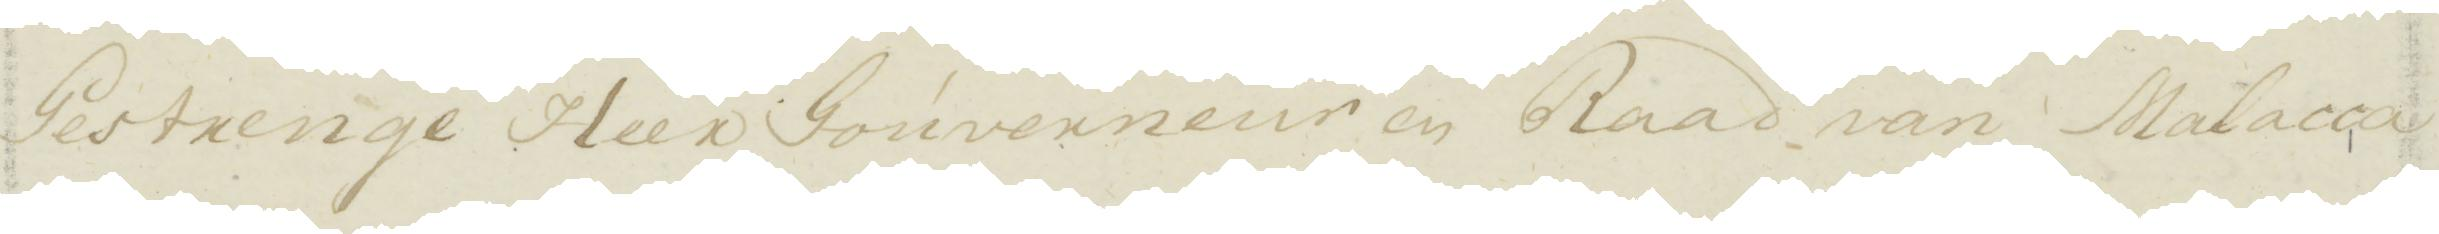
Gestrenge Heer Gouverneur en Raad van Malacca
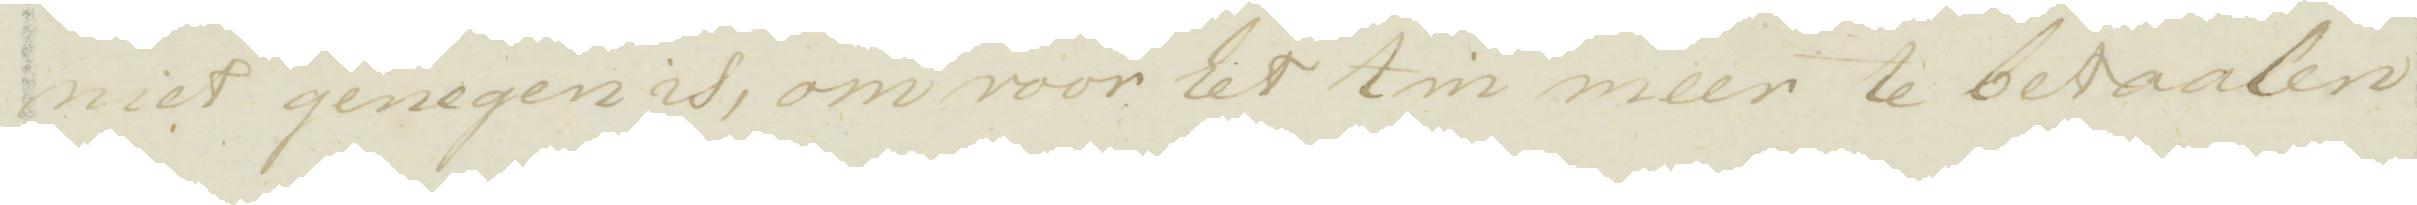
niet genegen is, om voor het tin meer te betaalen
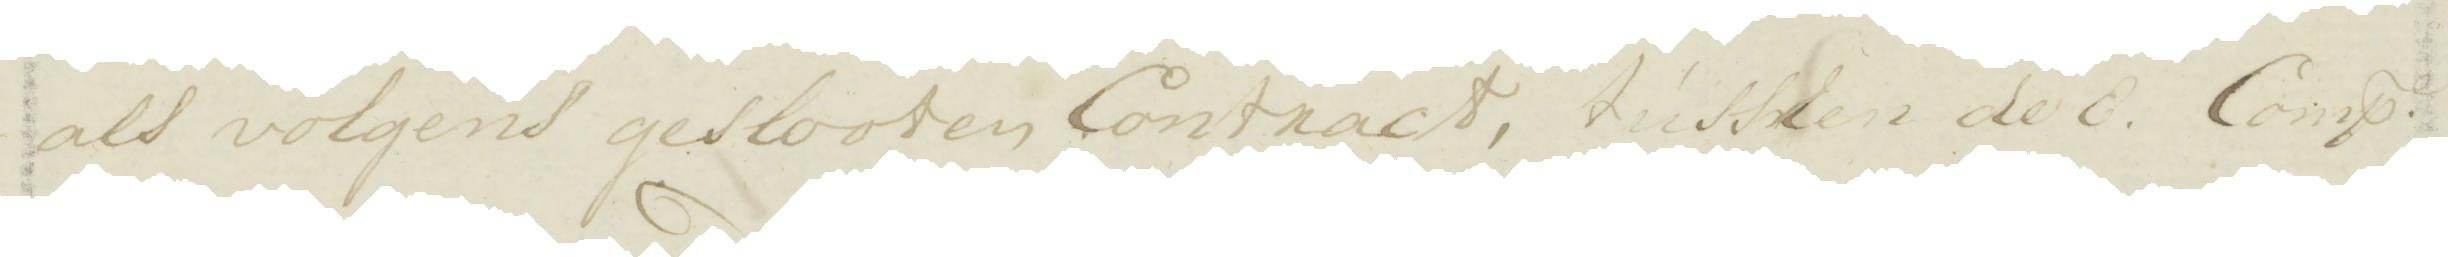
als volgens geslooten Contract, tussten de E. Comp=e
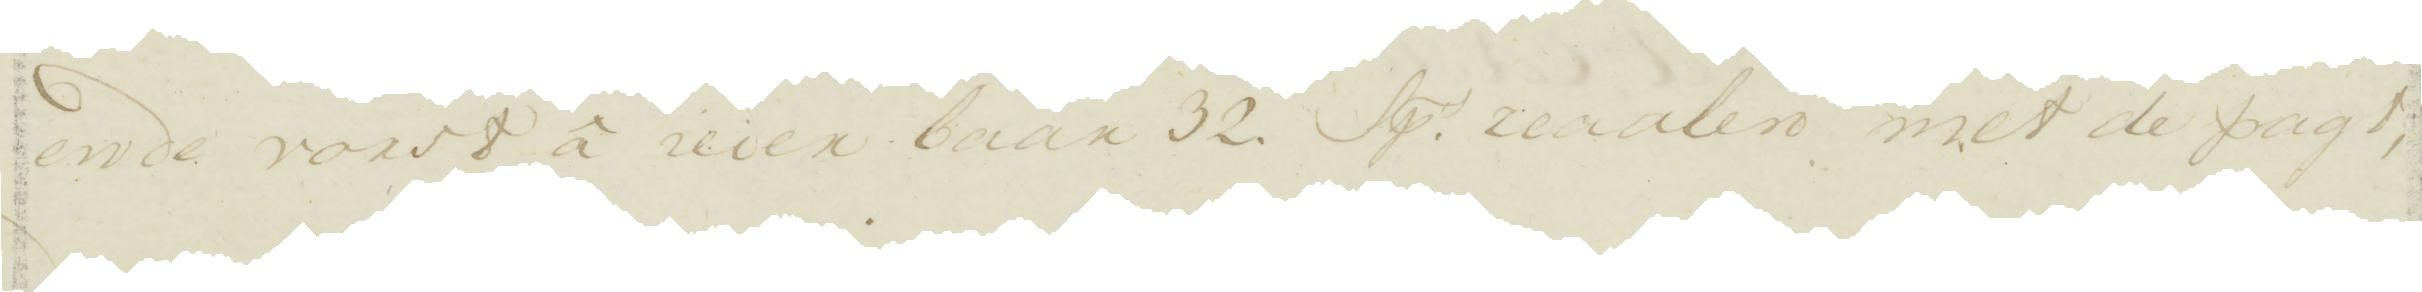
ende vorst â ieder baar 32 Sp:s reaalen met de pagt;
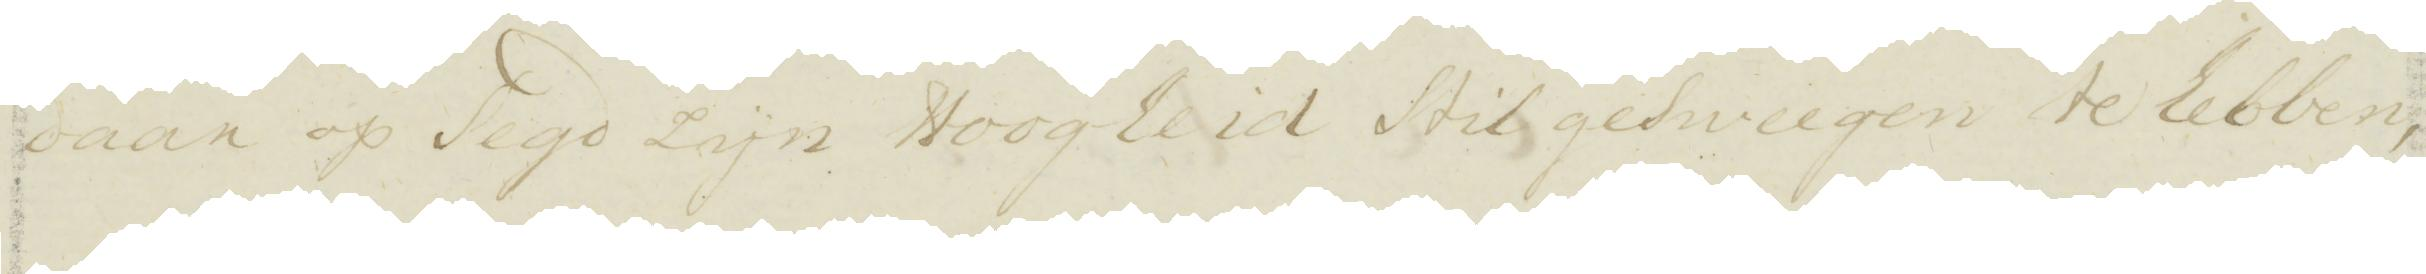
daar op segd zijn Hoog Eedel stilgesweegen te hebben,
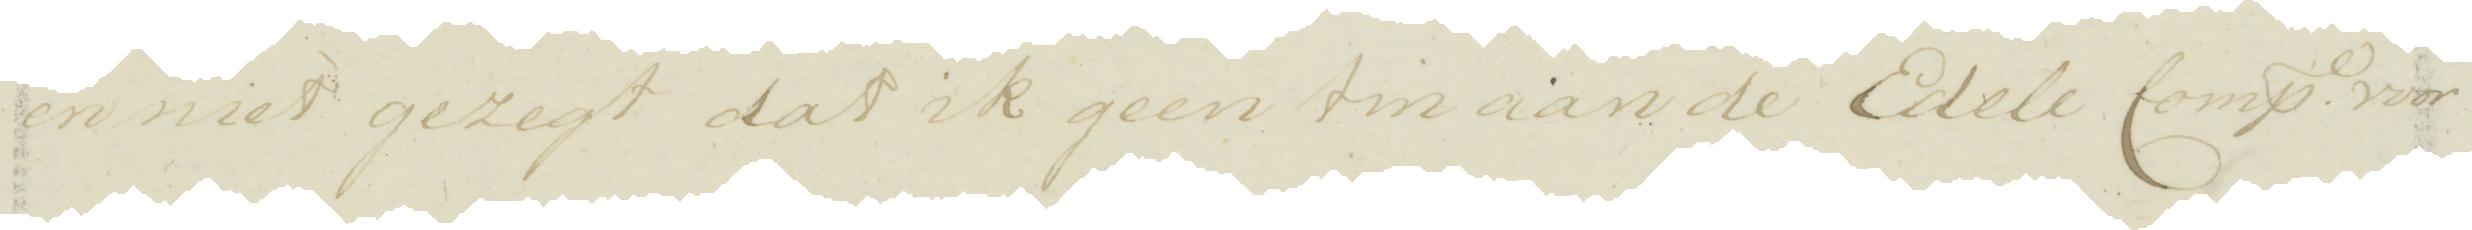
en niet gezegt dat ik geen tin aan de Edele Comp: voor
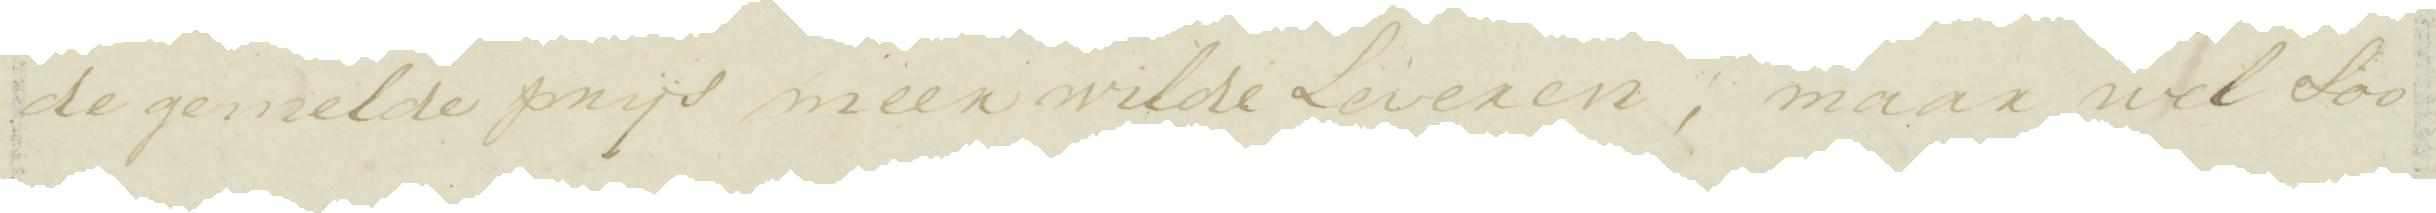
de gemelde prijs meer wilde leveren; maar wel soo
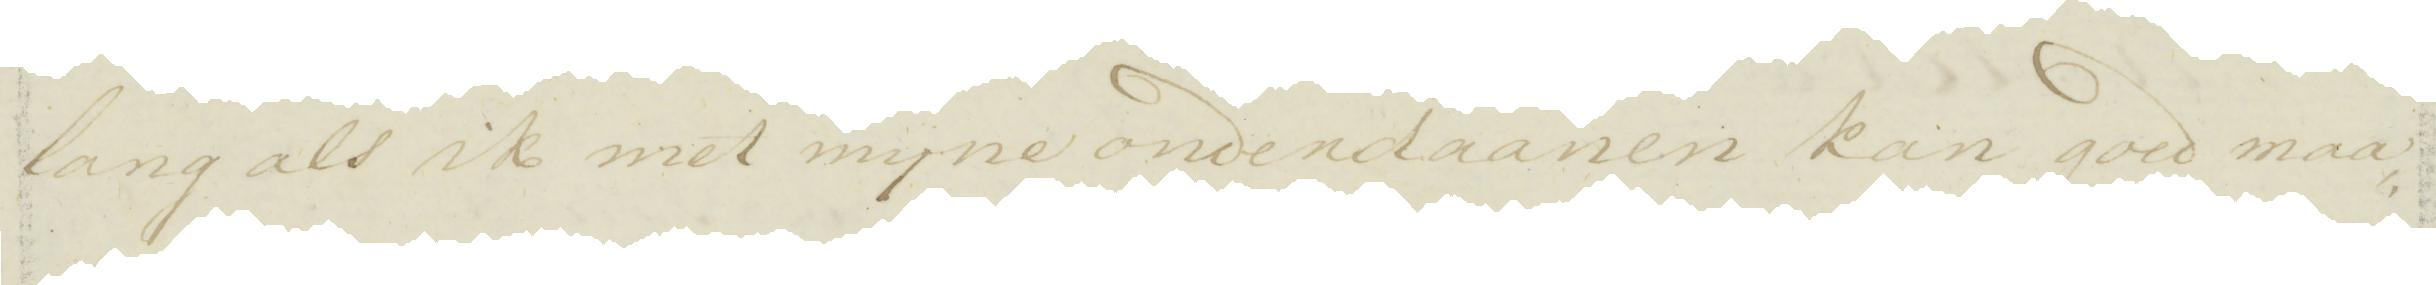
lang als ik met mijne onderdaanen kan goed maa„
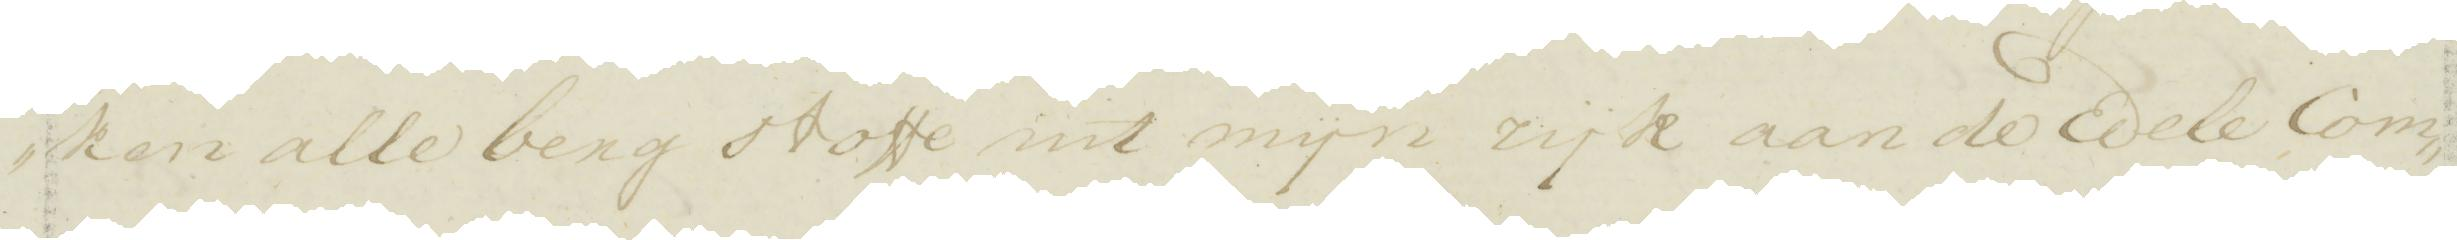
„ken alle berg stoffe uit mijn rijk aan de Edele Com„
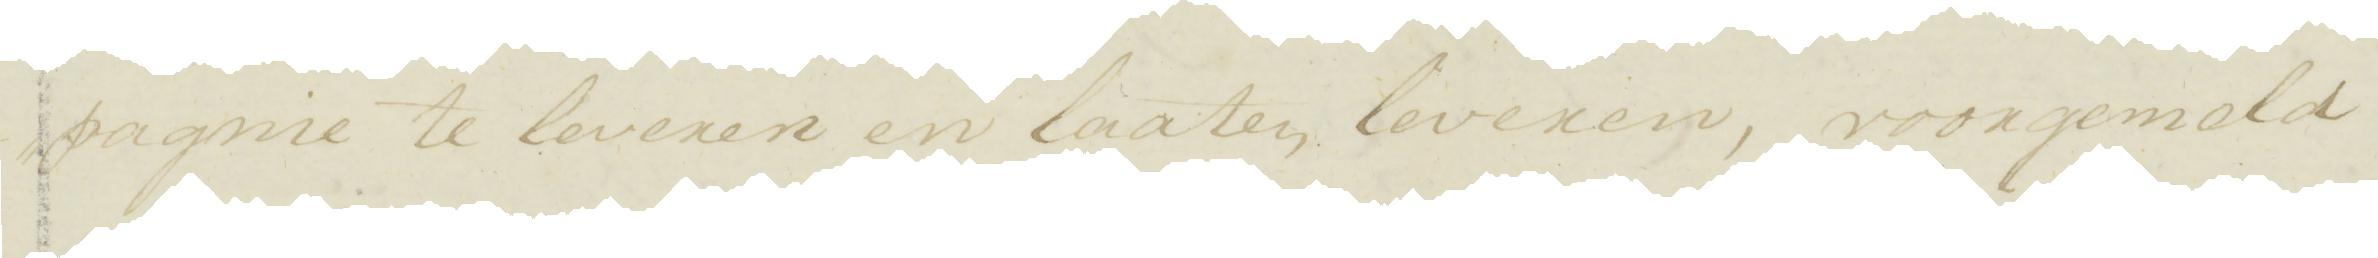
„pagnie te leveren en laaten leveren, voorgemeld
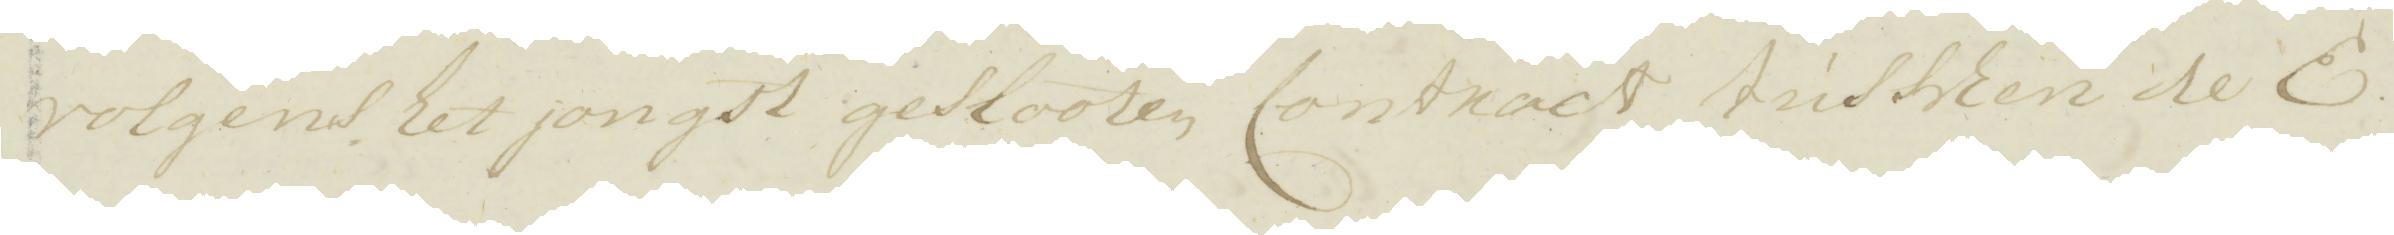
volgens het jongst geslooten Contract tusschen de E
